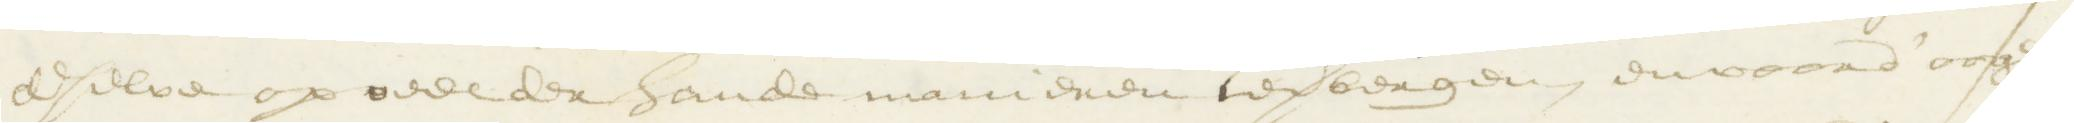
deselve op veelder hande manieren te verbergen, en voord’ oogen
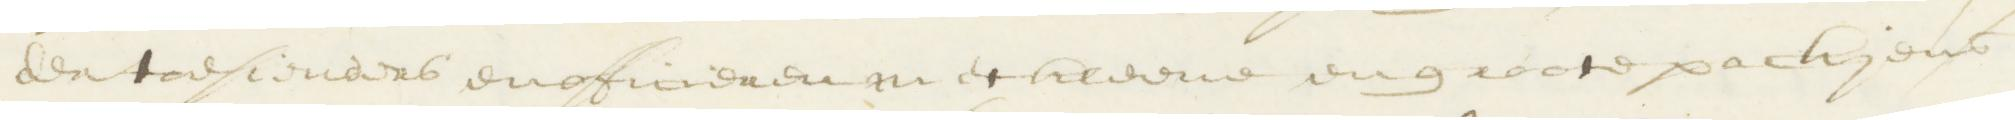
der toesienders en officieren met kleene en groote packjens
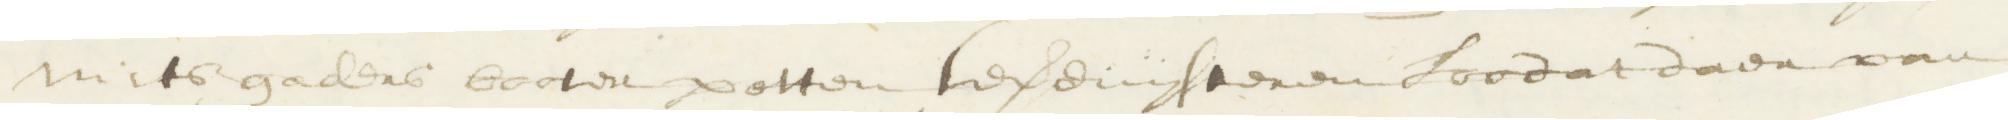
mitsgaders booter potten teverduijsteren soodat daer van
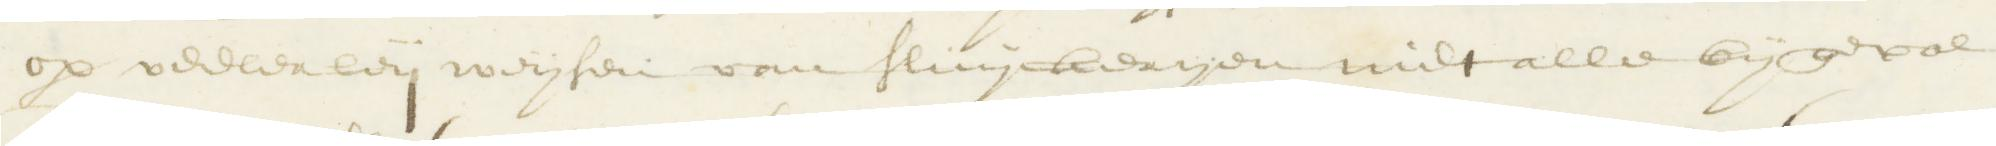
op veelerleij weijsen van sluijckerijen niet alle bijgevol
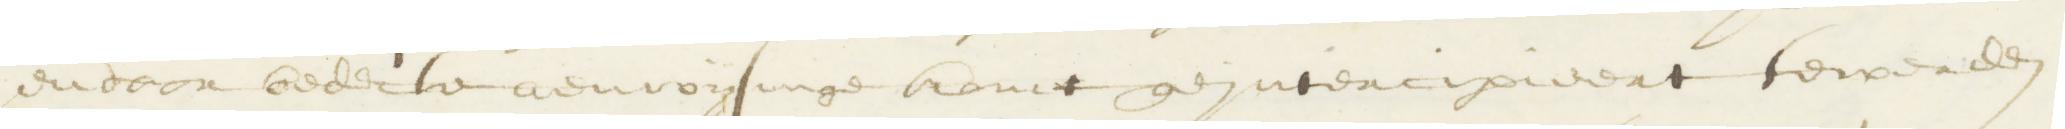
en door bedecte aenwijsinge komt gejntercipieert tewerden
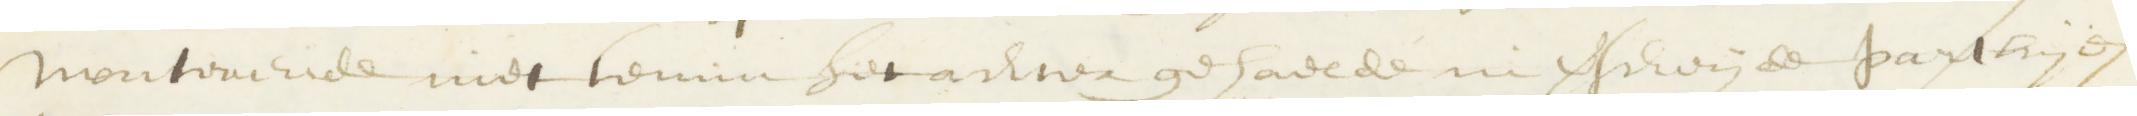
monterende niet temin het achter gehaelde in verscheijde parthijen
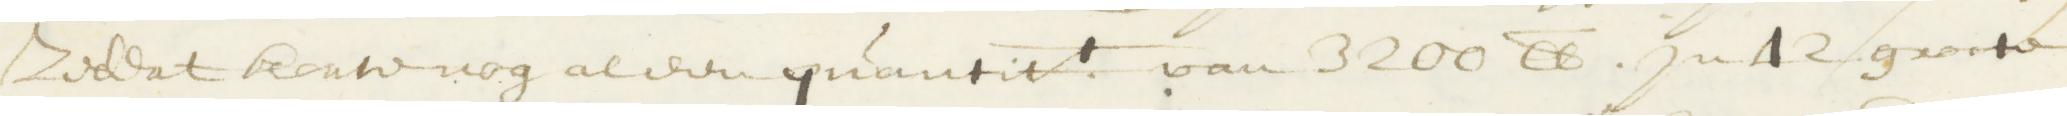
zedert korte nog al een quantit.t van 3200 lb. jn 42 groote
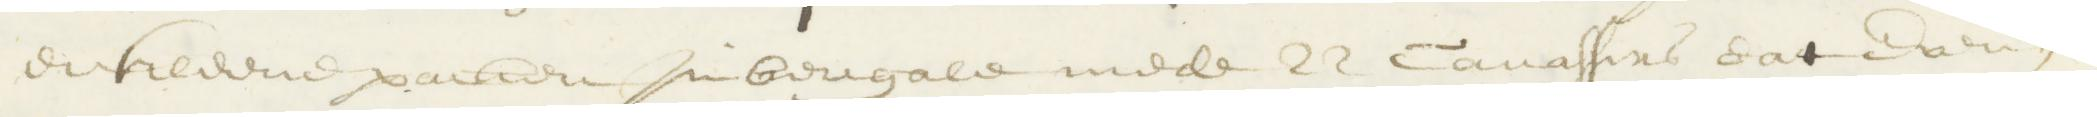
en kleene packen jn bengale mede 22 Canassers dat Even„
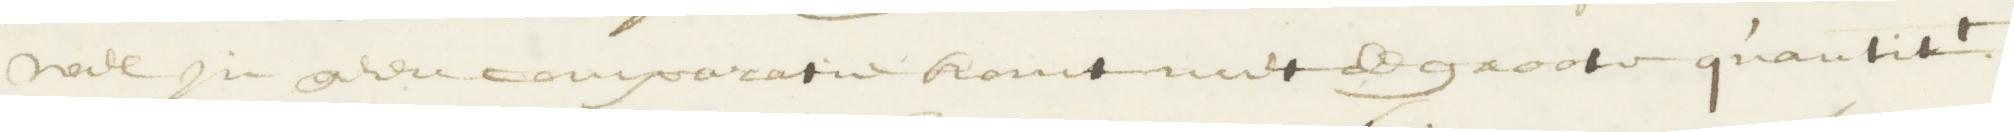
wel jn geen comparatie komt met de groote quantit.t
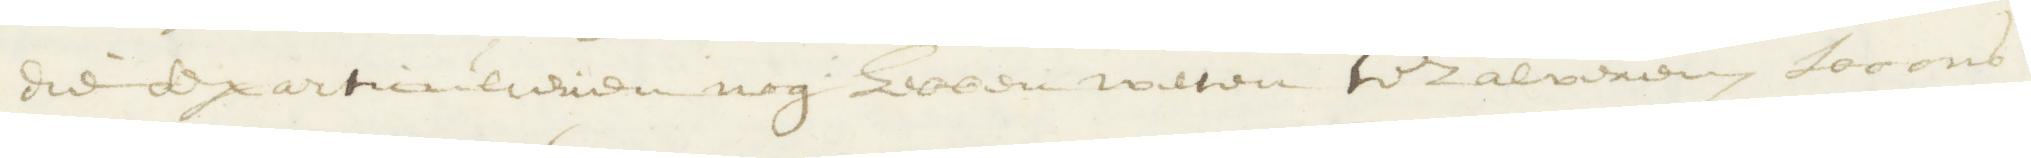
die de particulieren nog hebben weten te zalveren, soo ons
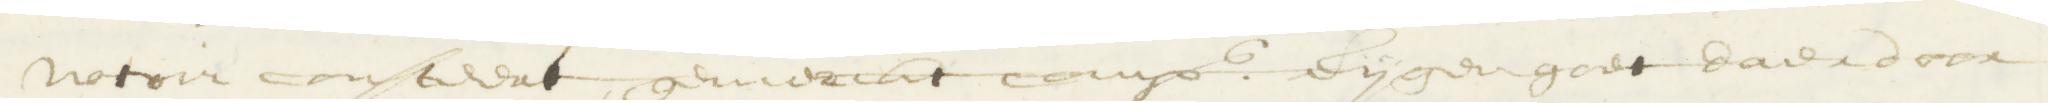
notoir consteert, gemerckt comp.s Eijgen goet daerdoor
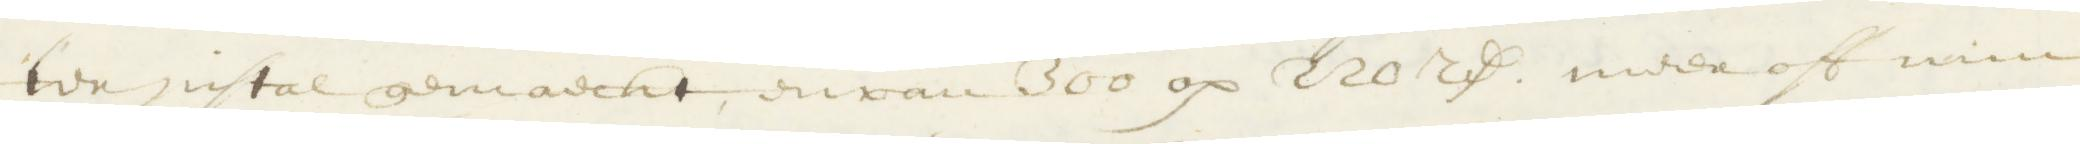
ter jnstal gemaeckt, en van 300 op 220 rds. meer off min
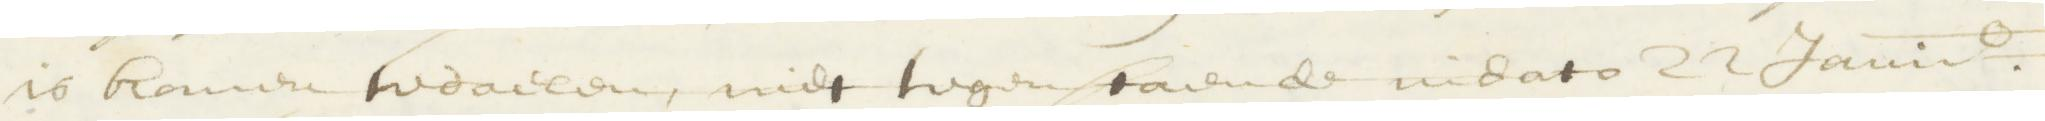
is komen te daelen, niet tegenstaende in dato 22 Janu.o
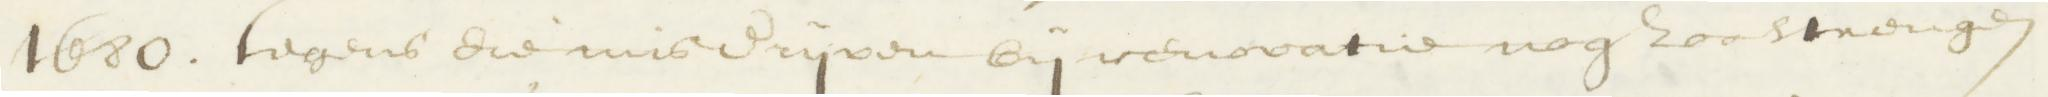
1680. tegens die misdrijven bij renovatie nog zoo strengen
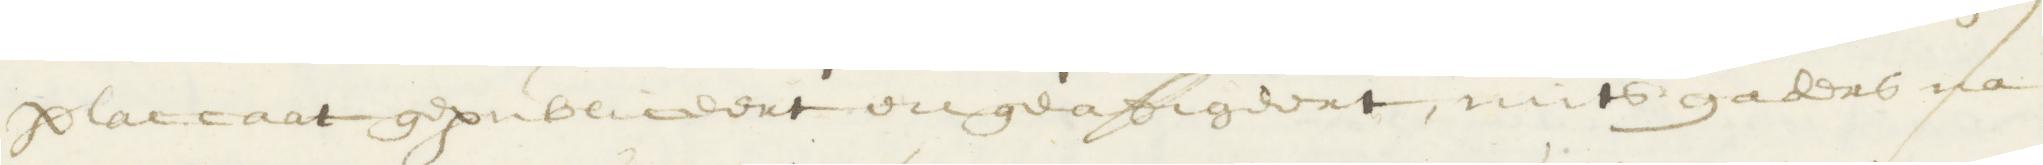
placcaat gepubliceert en geafigeert, mitsgaders na
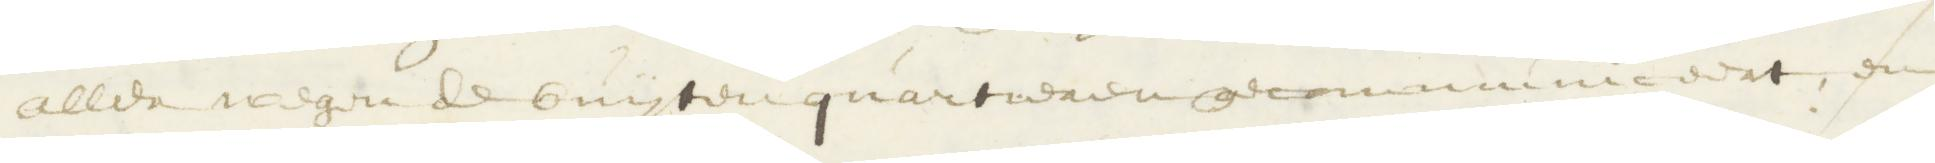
aller wegen de buijtenquartieren gecommuniceert, en
